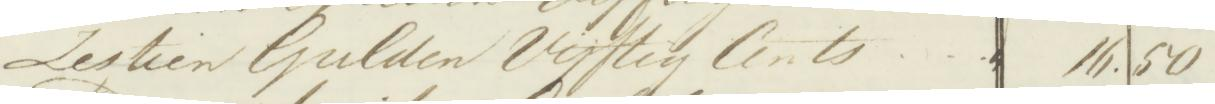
Zestien Gulden Vijftig Cents . . . „ 16.50
